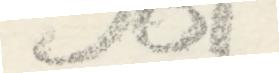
361
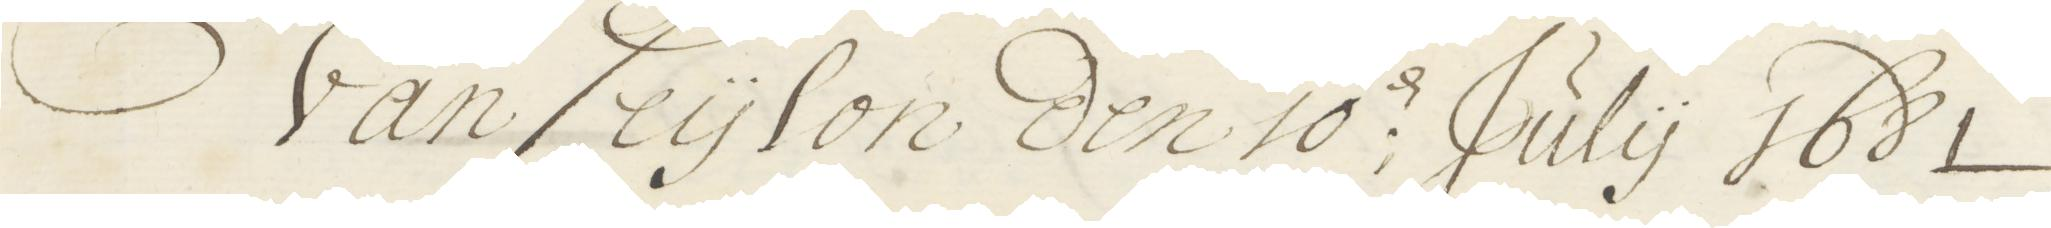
Van Ceijlon den 10:en Julij 1681
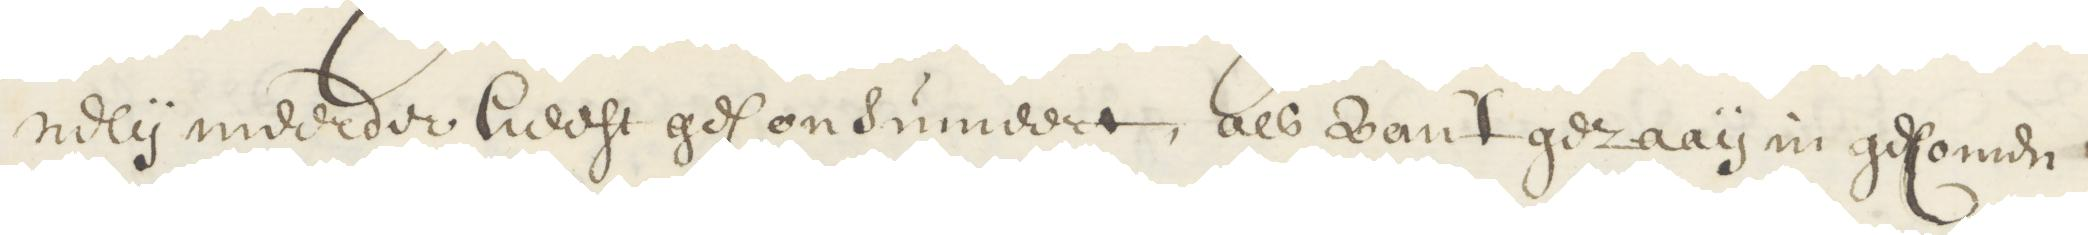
nelij meerder heeft geconsumeert, als van ’t gezaaij in gecomen
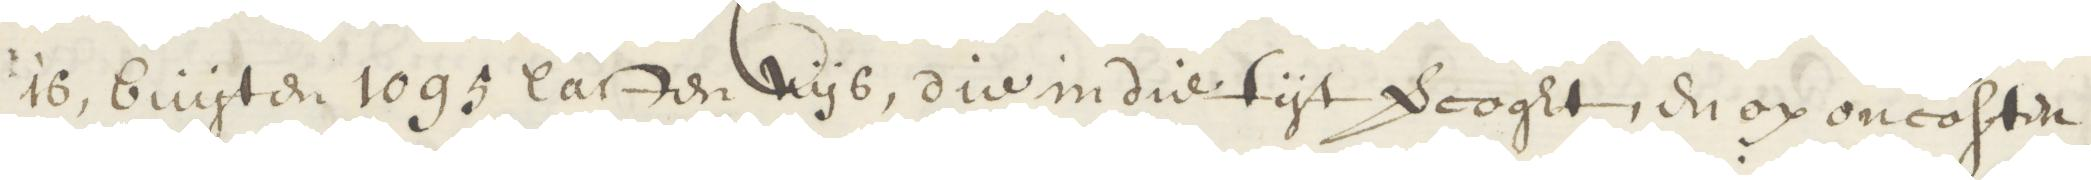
is, buijten 1095 lasten rijs, die in die tijt vercoght, en op oncosten
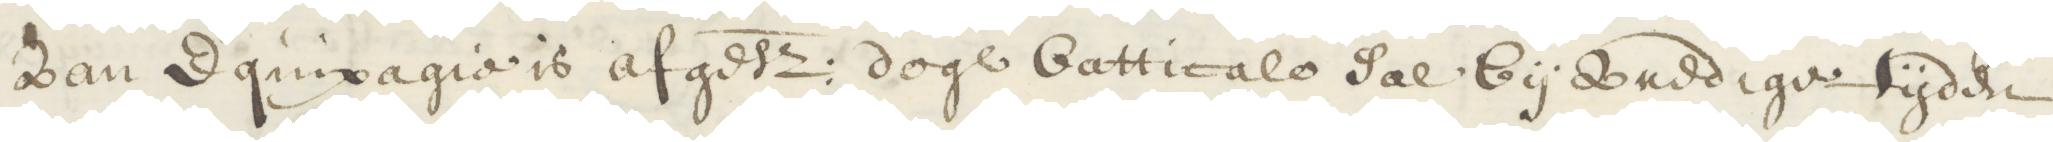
van Equipagie is afgesz: dogh batticalo Sal bij vredige tijden
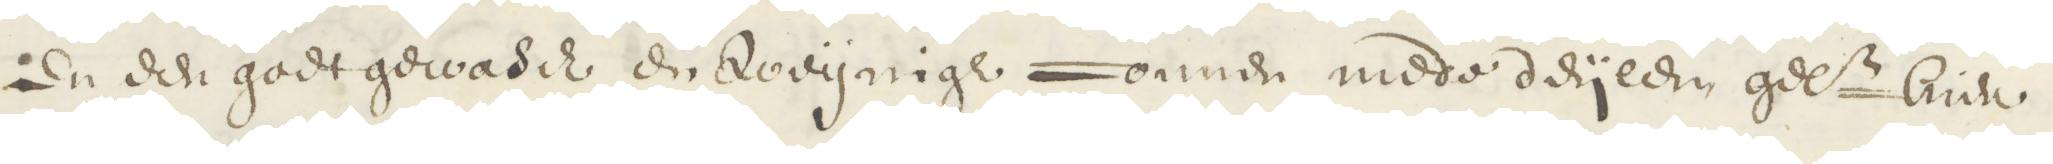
en een goet gewasch en weijnigh Connen mede deijlen gelijk hier
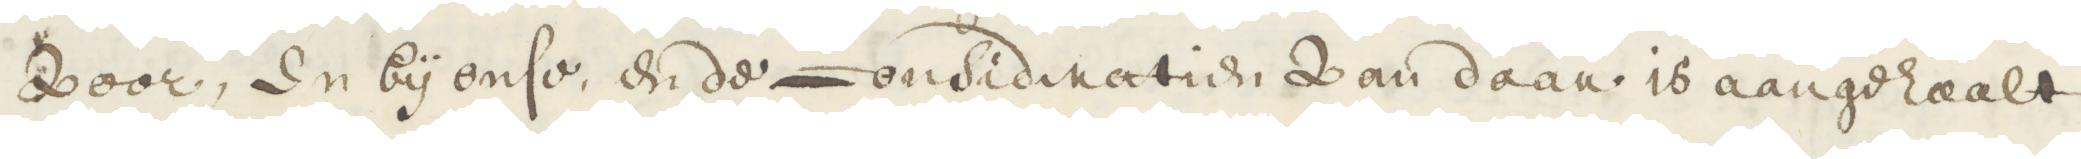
voor, en bij onse, en de Consideratien van daar is aangehaalt
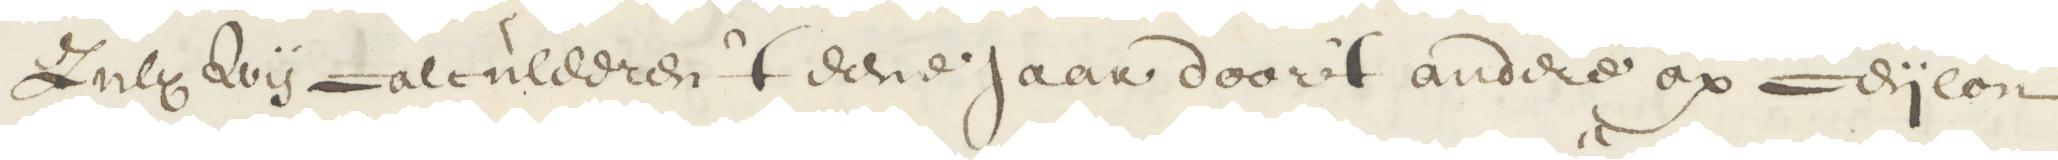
Zulx wij calculeeren ’t eene Jaar door 't andere op Ceijlon
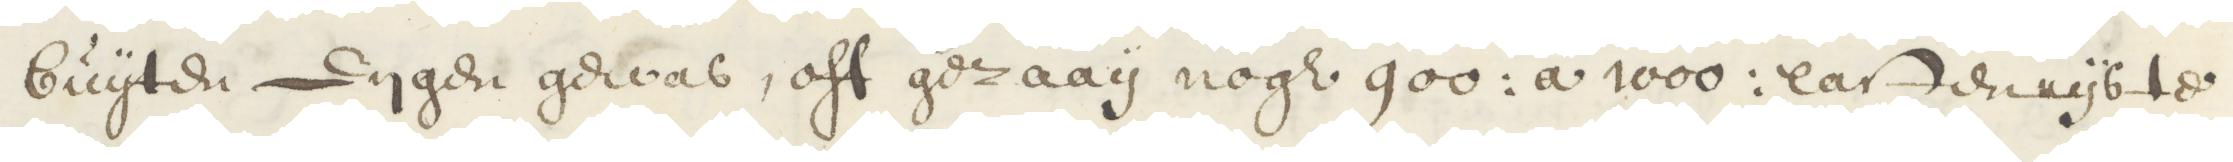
buijten Eijgen gewas, oft gezaaij nogh 900: â 1000: lasten rijs te
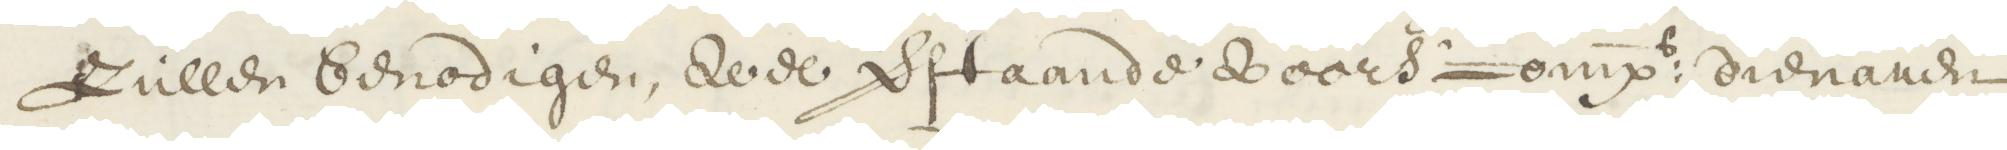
Zullen benodigen, wel verstaande voors' comp:s dienaren
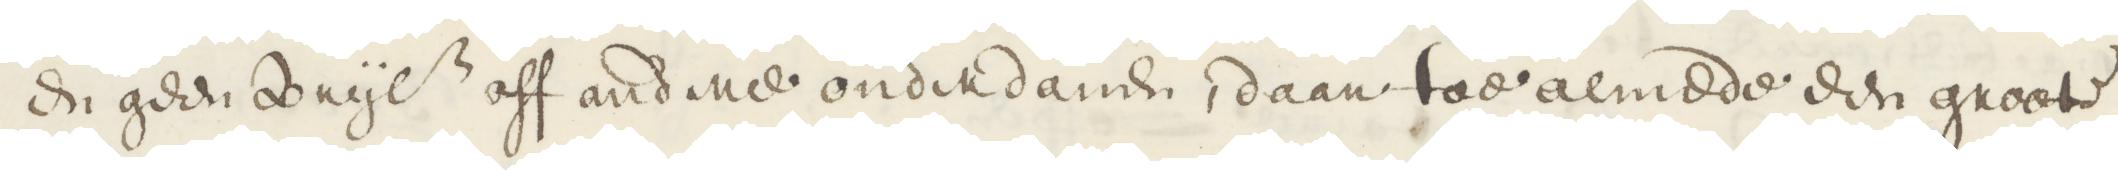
en geen vrijl:en off andere onderdanen, daar toe almede een groote
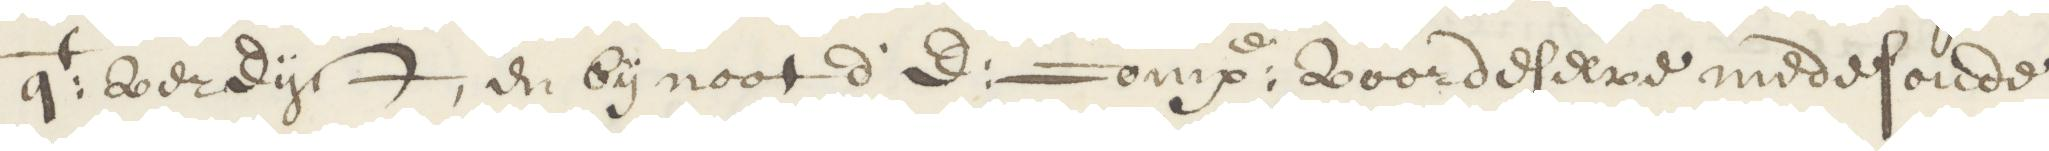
q:t vereijst, en bij noot d’ E: Comp:e voor deselve mede soude
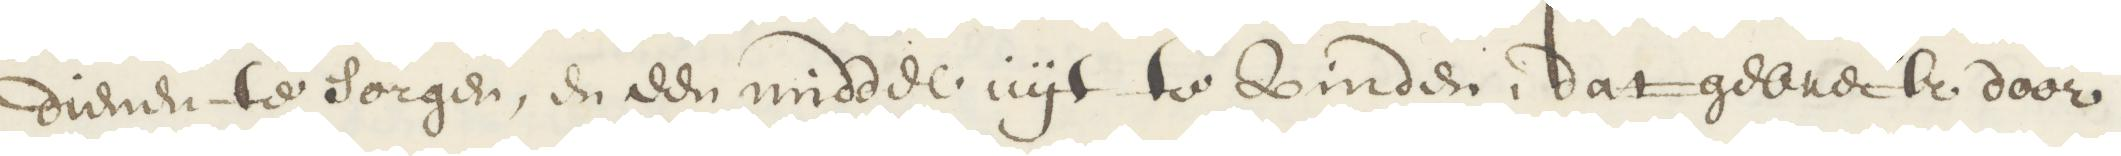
dienen te Sorgen, en een middel uijt te vinden, dat gebreck door
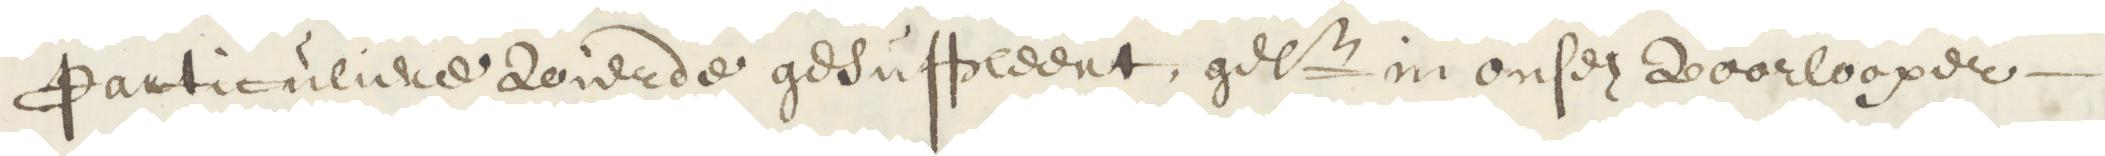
Particuliere wierde gesuppleert, gelijk in onsen voorlooper —
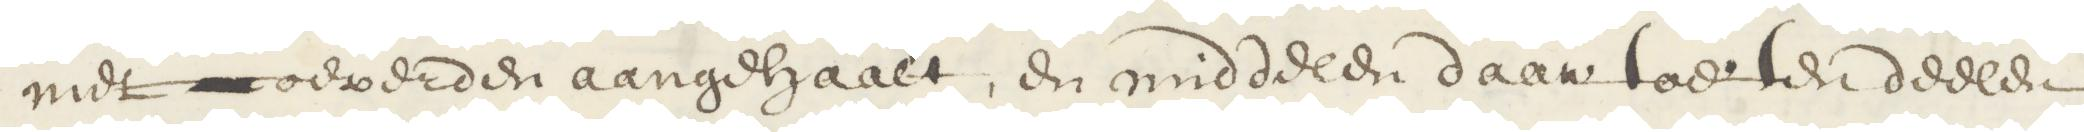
met coeverden aangehaalt, en middelen daar toe ten deelen
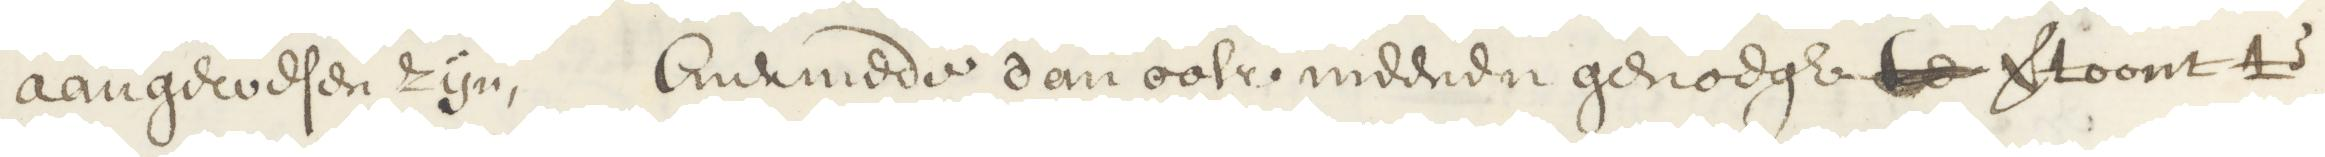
aangewesen zijn, hiermede dan ook meeren genoegh te vertoont te
